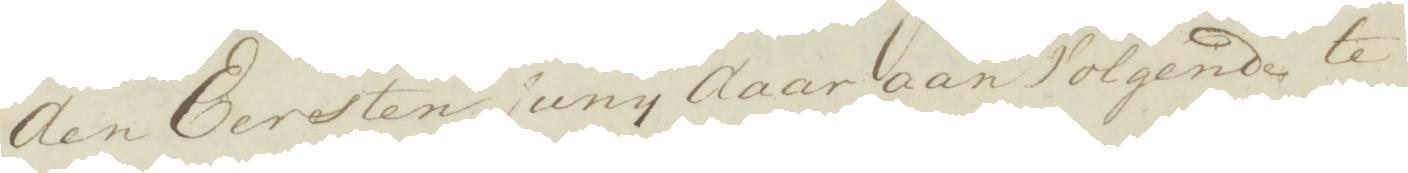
den Eersten Juny daar aan volgende te
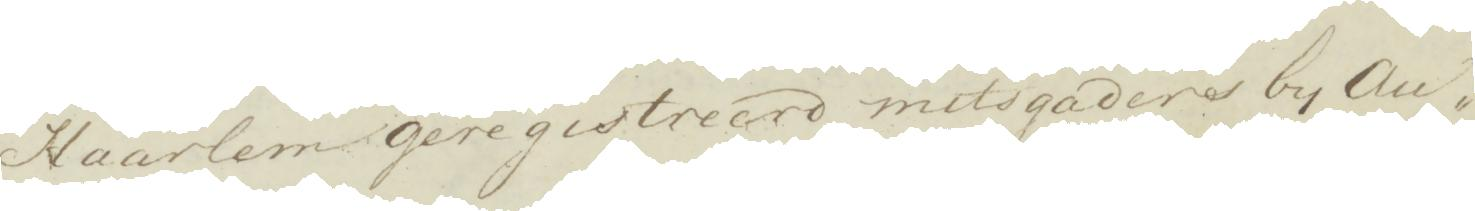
Haarlem geregistreerd mitsgaders by Au„
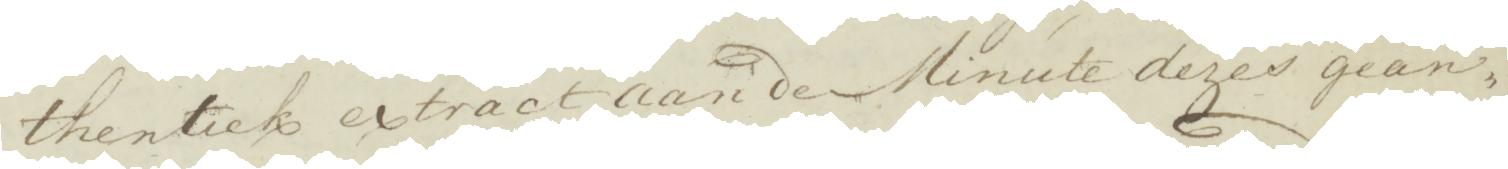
thentiek extract aan de Minute dezes gean„
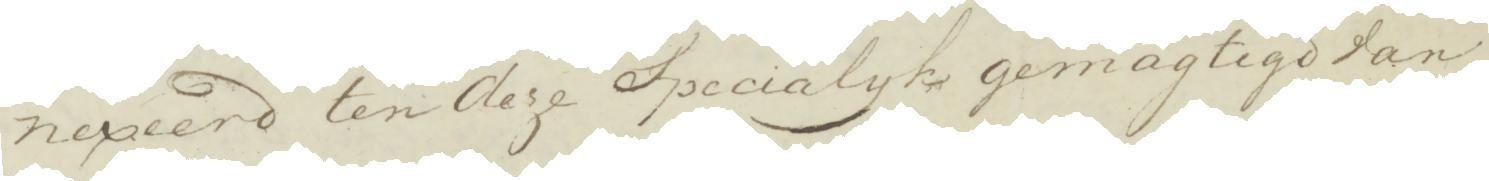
nexeerd ten deze Specialyk gemagtigd van
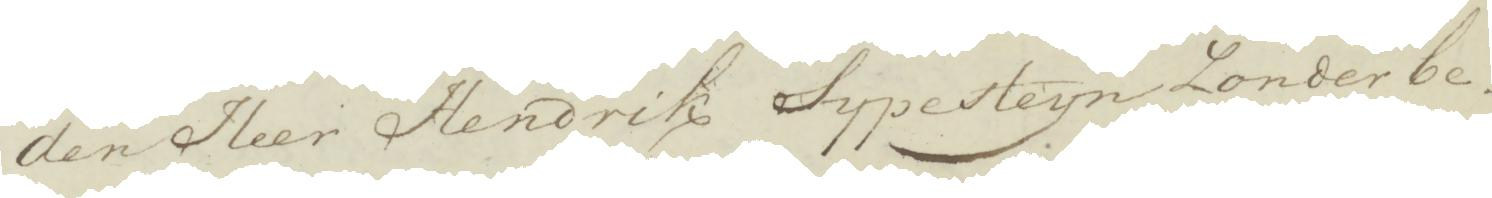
den Heer Hendrik Sypesteyn, zonder be
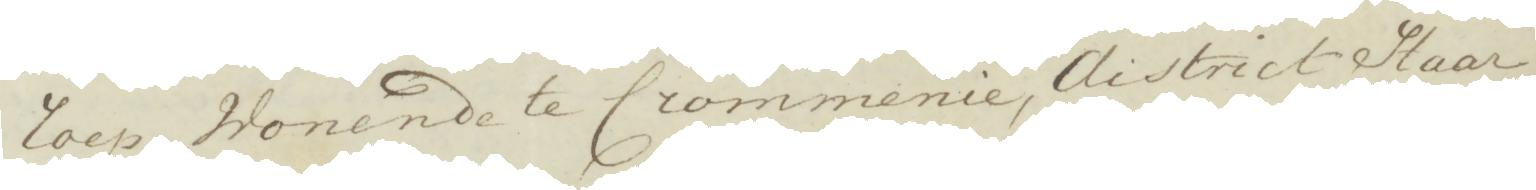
roep, wonende te Crommenie, district Haar
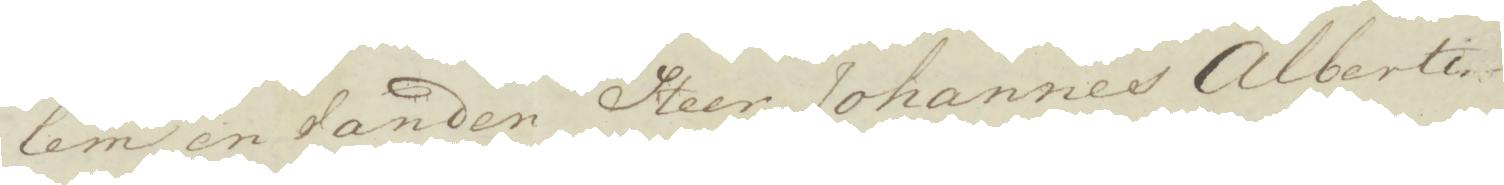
lem, en van den Heer Johannes Alberti,
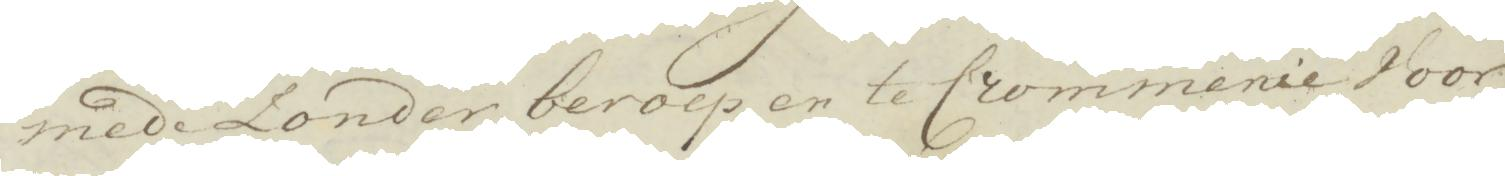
mede zonder beroep, en te Crommenie voor
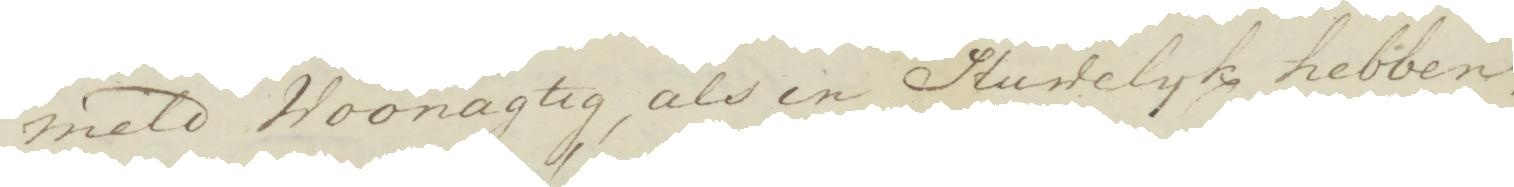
meld woonagtig, als in Huwelyk hebben
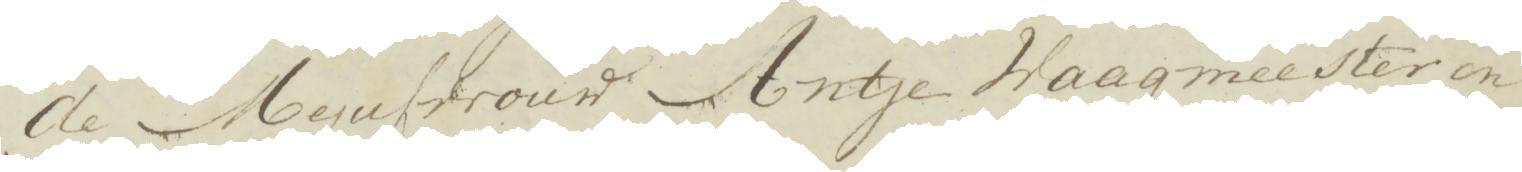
de Mejufvrouw Antje Waagmeester, en
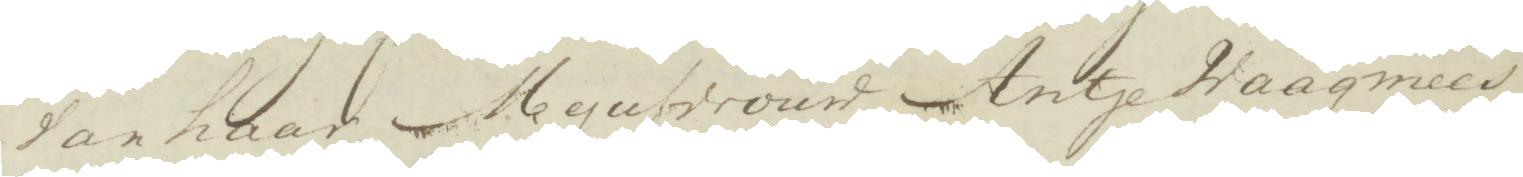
van haar Mejufvrouw Antje Waagmees
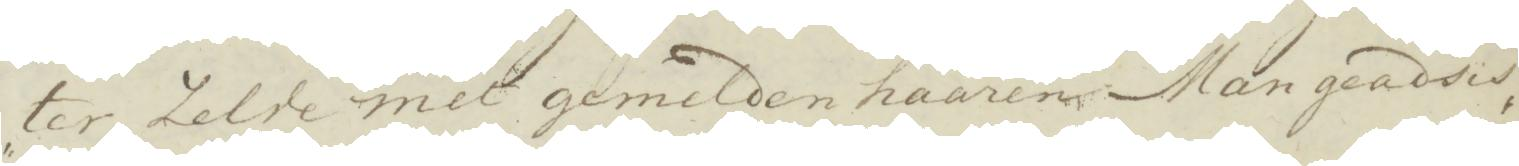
„ter, zelve met gemelden haaren Man geadsis„
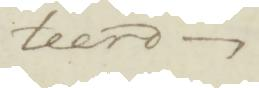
teerd—
